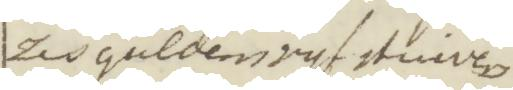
zes guldens vyf stuivers
